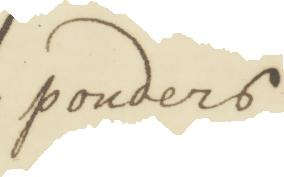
ponders
